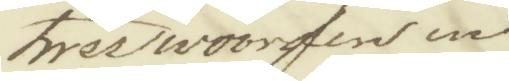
twee woorden in
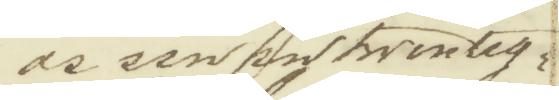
de een en twintig„
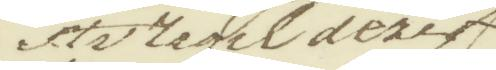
ste regel dezer
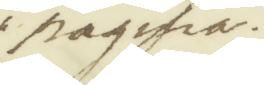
pagina.
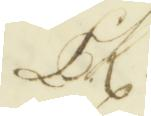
LK
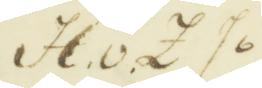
H.v.Z Jr
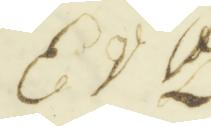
E V Z
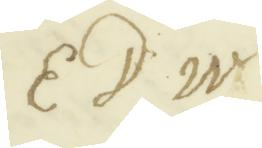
E D W
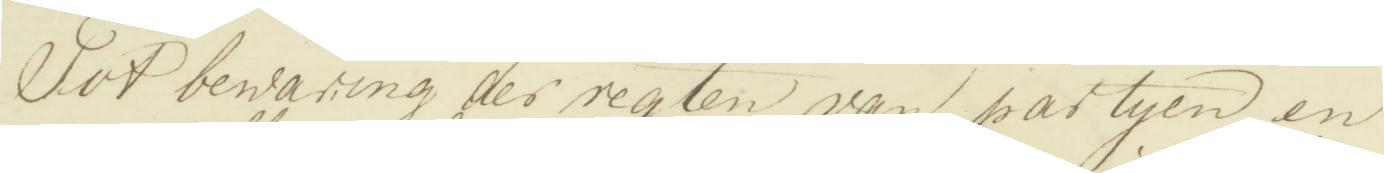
Tot bewaring der regten van partyen en
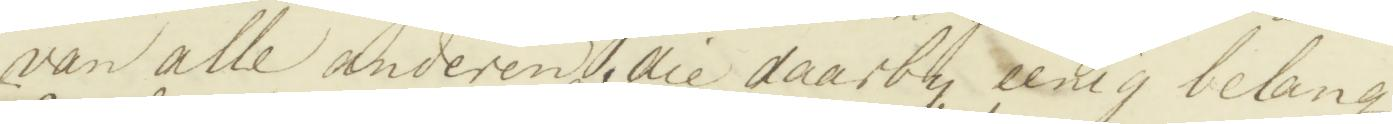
van alle anderen, die daarby eenig belang
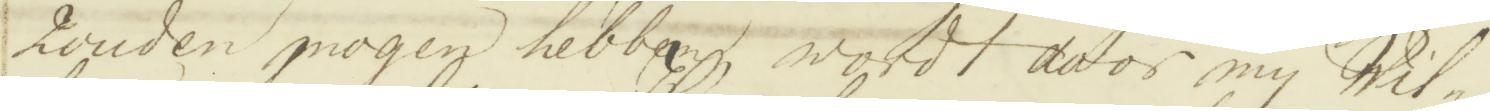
zouden mogen hebben wordt door mij Wil„
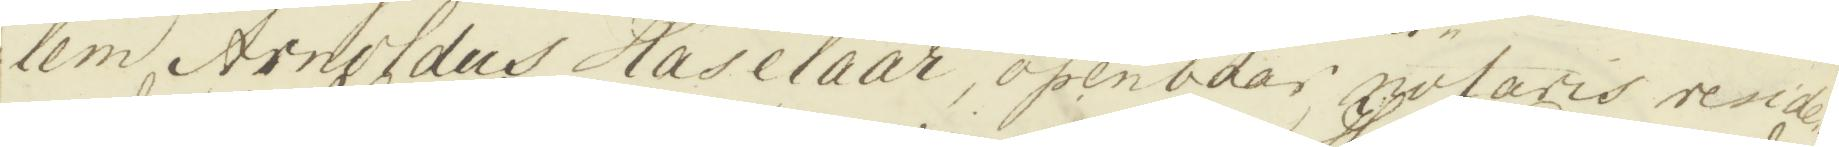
„lem Arnoldus Haselaar, openbaar notaris reside
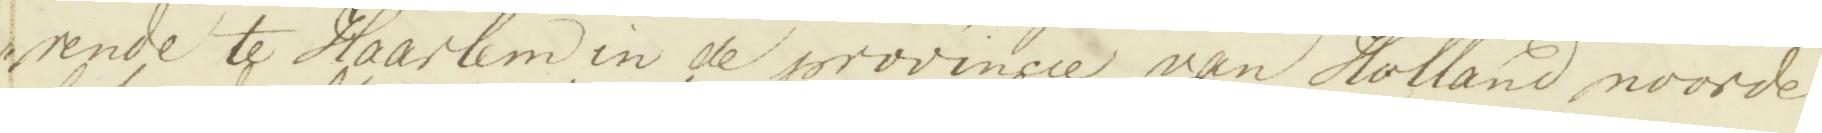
rende te Haarlem in de provincie van Holland, noorde
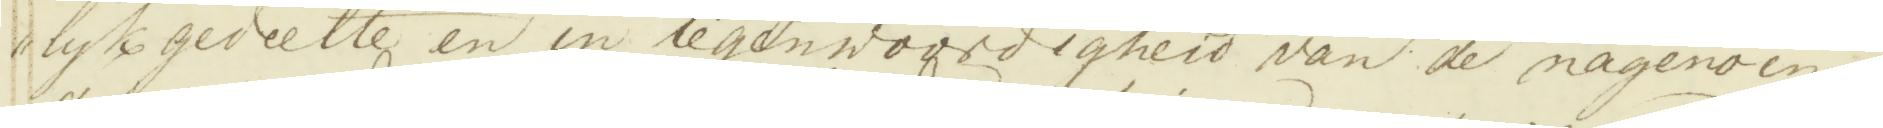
„lyk gedeelte en in tegenwoordigheid van de nagenoem
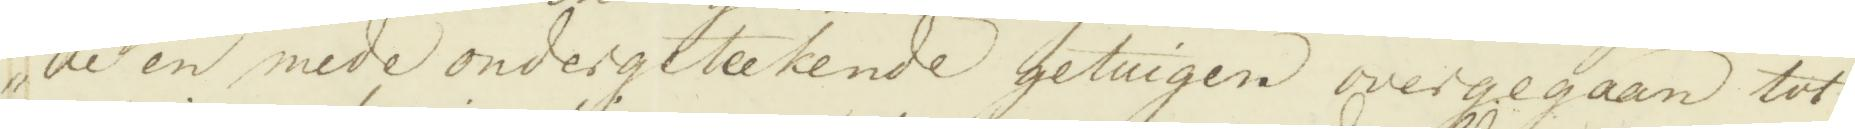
„de en mede ondergeteekende getuigen overgegaan tot
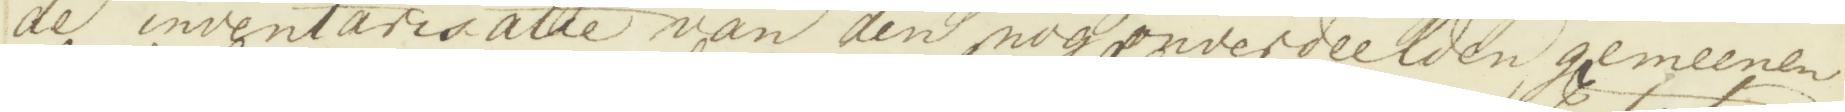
de inventarisatie van den nog onverdeelden gemeenen
